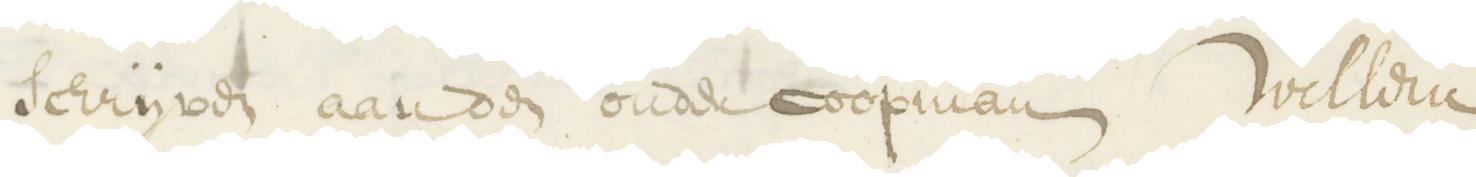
schrijven aan den onder coopman Willem
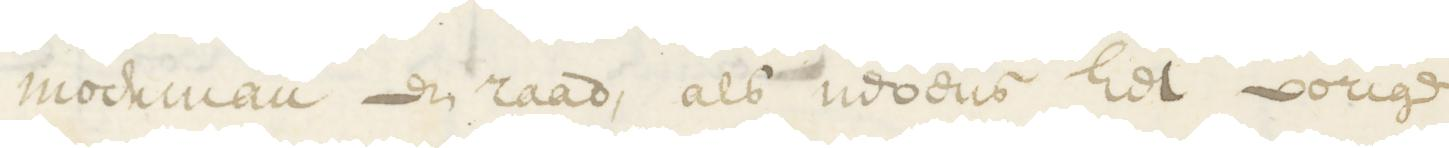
moerman en raad, als nevens het vorige
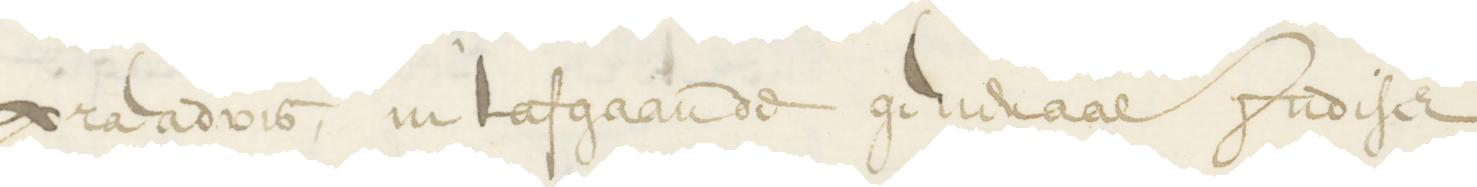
praeadvis, in ’t afgaande generaal Judisch
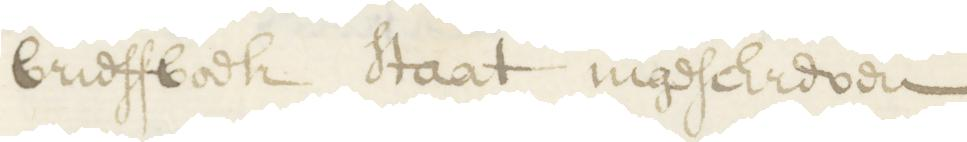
brieffboek staat ingeschreven
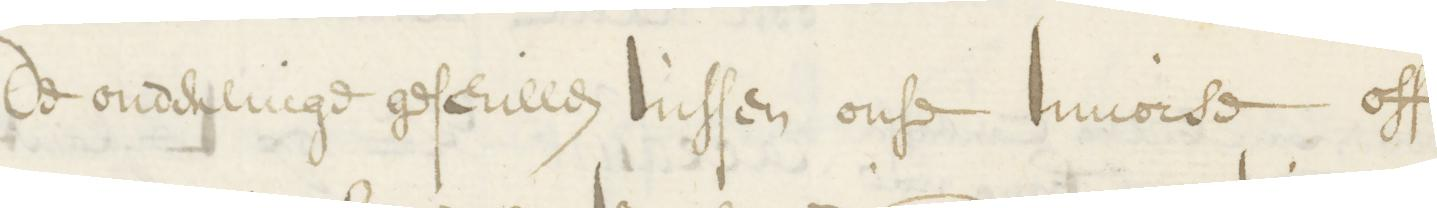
de onderlinge geschillen tussen onse timorse off
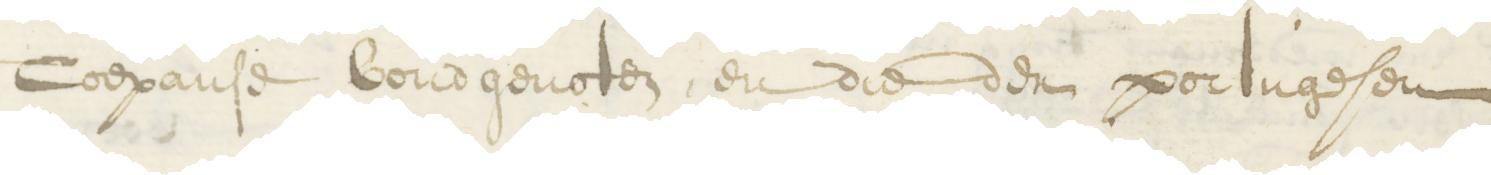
Coepanse bondgenoten, en die der portugesen
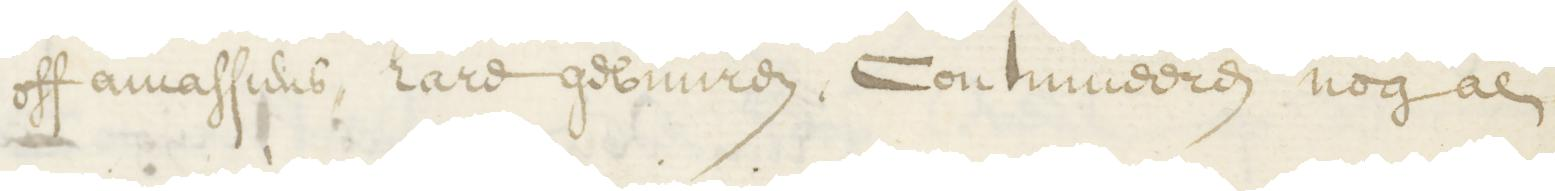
off amassiers, hare gebuuren, Continueeren nog aen
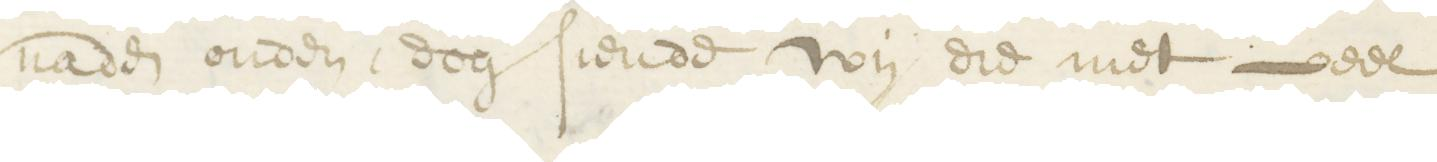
nader onden, dog siende wij die niet veel
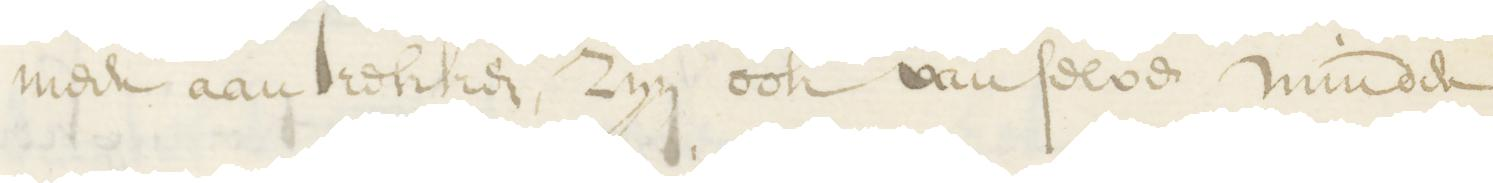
meer aan trekken, zijn ook vanselve minder
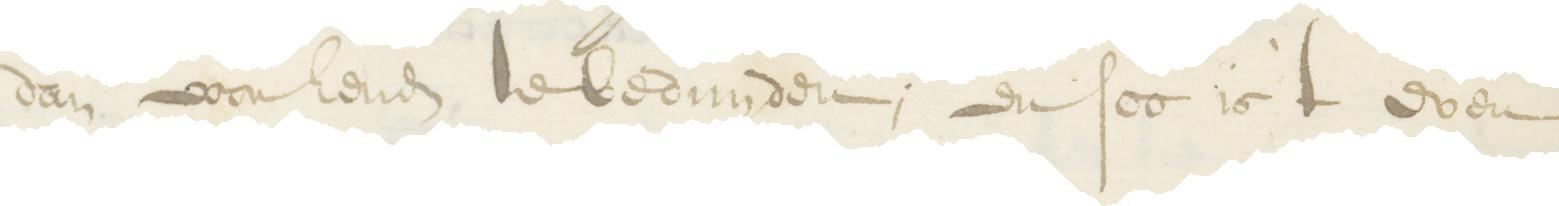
dan voor henen te beduijden; en soo is ’t even
